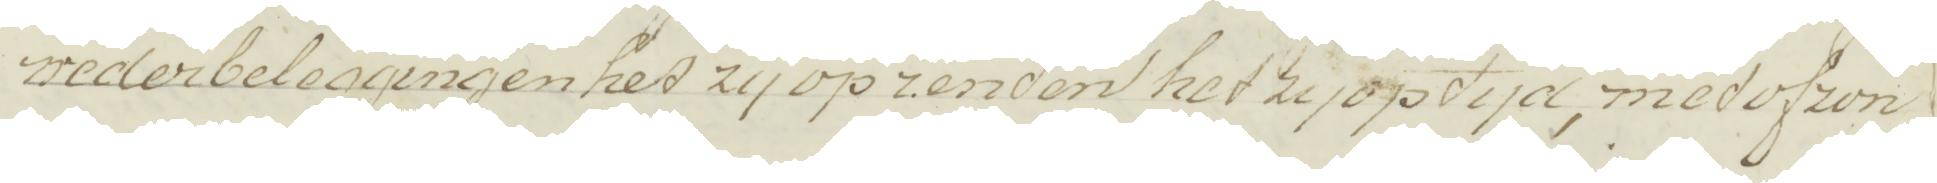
wederbeleggingen het zy op renten het zy op tyd, met of zon
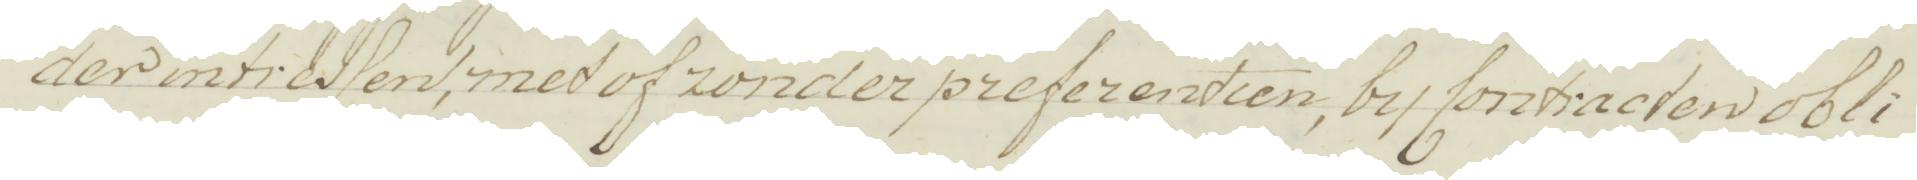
der intressen, met of zonder preferentien, by Contracten obli
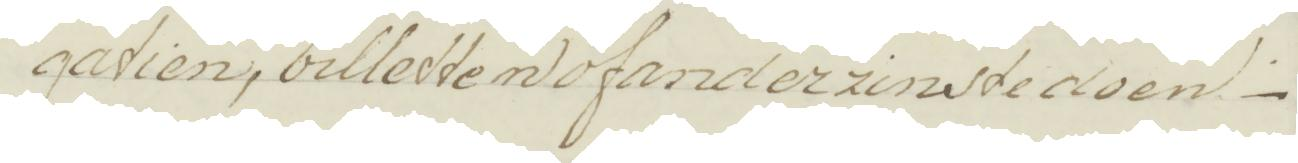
gatien, billetten of anderzins te doen. –
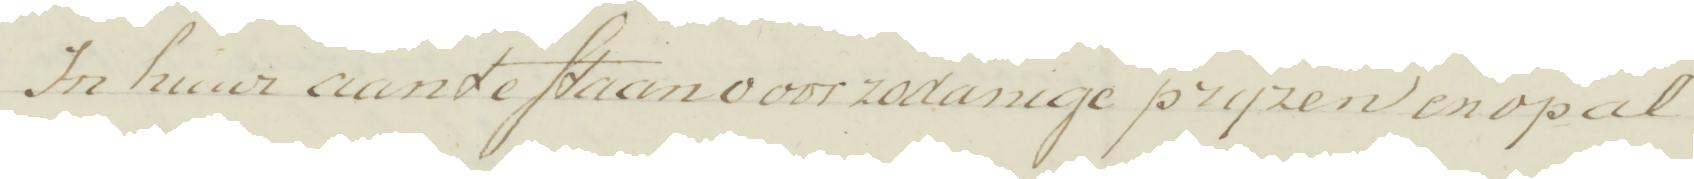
In huur aan te staan voor zodanige pryzen en op al
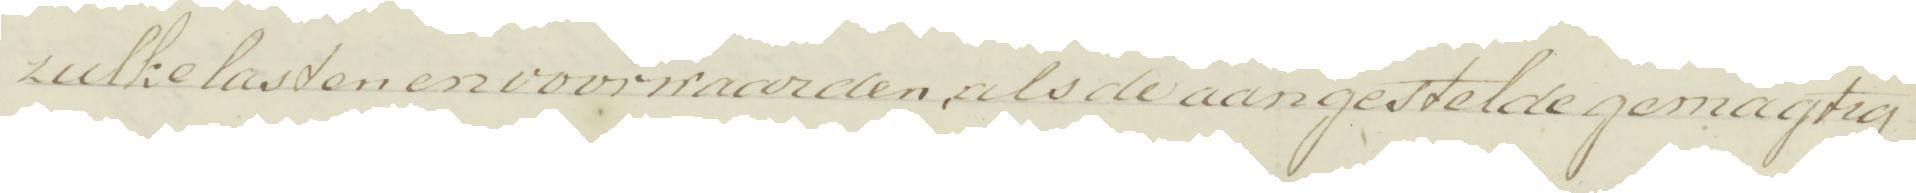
zulke lasten en voorwaarden als de aangestelde gemagtig
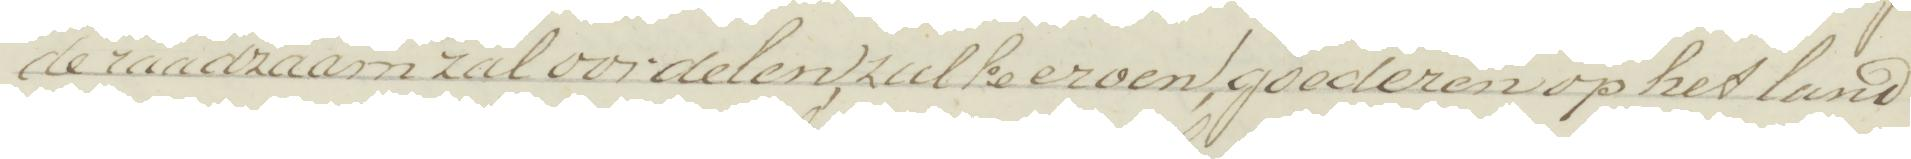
de raadzaam zal oordelen zulke erven, goederen op het land
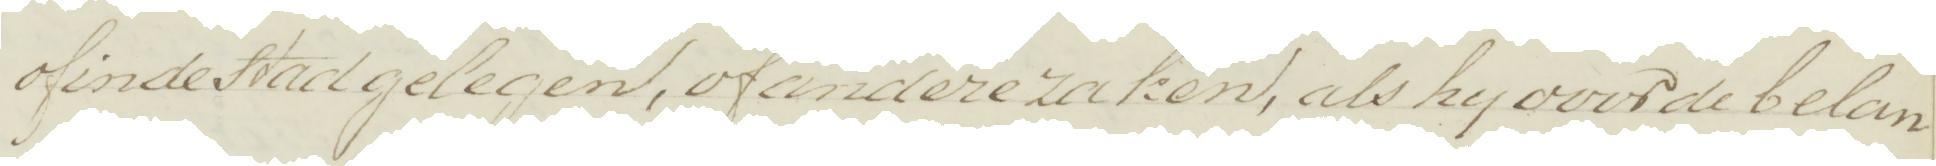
of in de stad gelegen, of andere zaken, als hy voor de belan
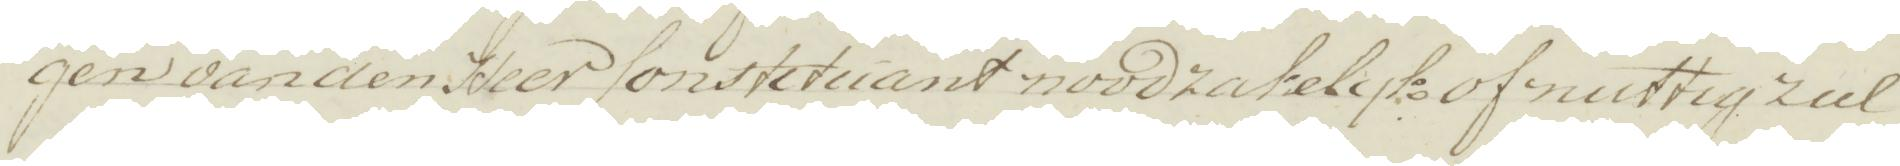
gen van den Heer Constituant noodzakelyk of nuttig zal
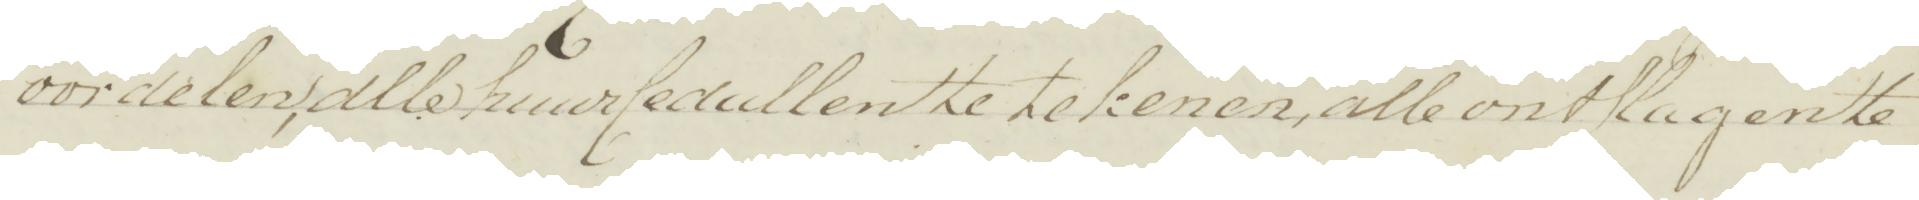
oordelen, alle huur Cedullen te tekenen, alle ontslagen te
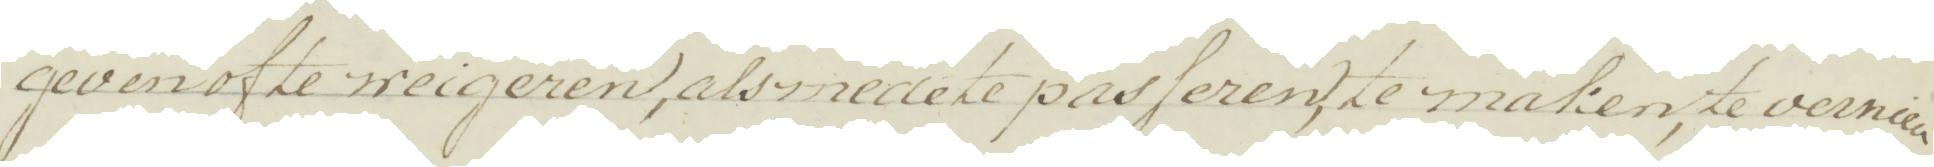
geven of te weigeren, als mede te passeren, te maken, te vernieu
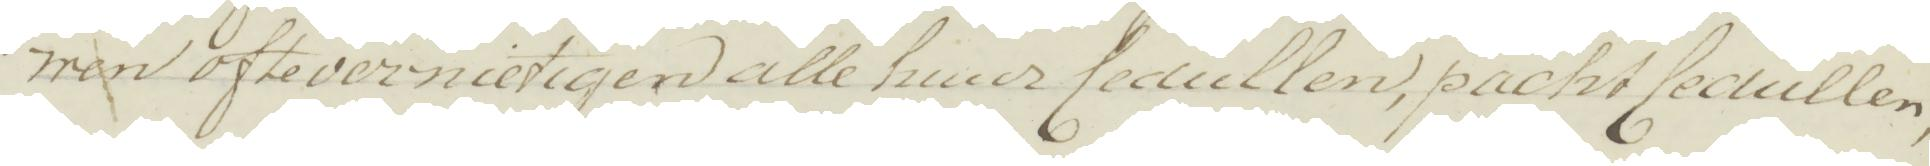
wen of te vernietigen alle huur Cedullen, pacht Cedullen,
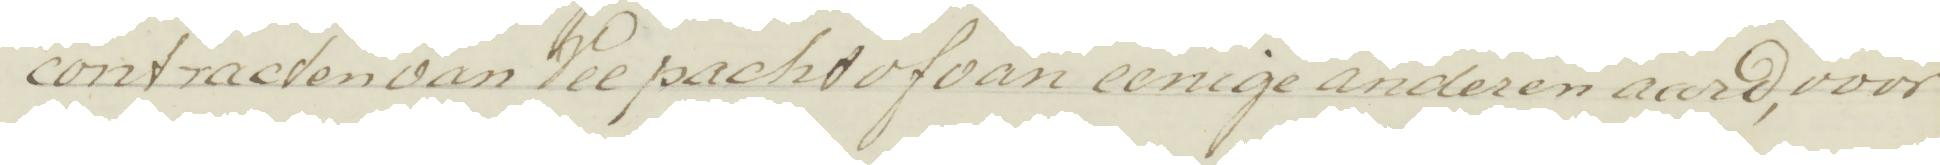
contracten van Vee pacht of van eenige anderen aard, voor
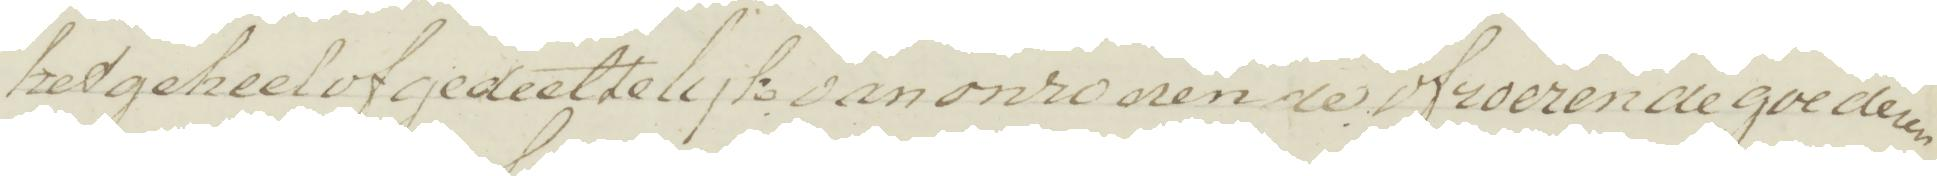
het geheel of gedeeltelijk van onroerende of roerende goederen
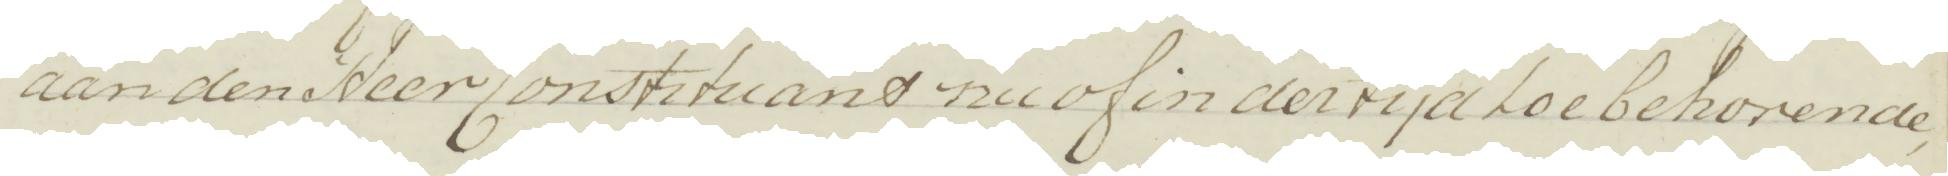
aan den Heer Constituant nu of in dertijd toe behorende,
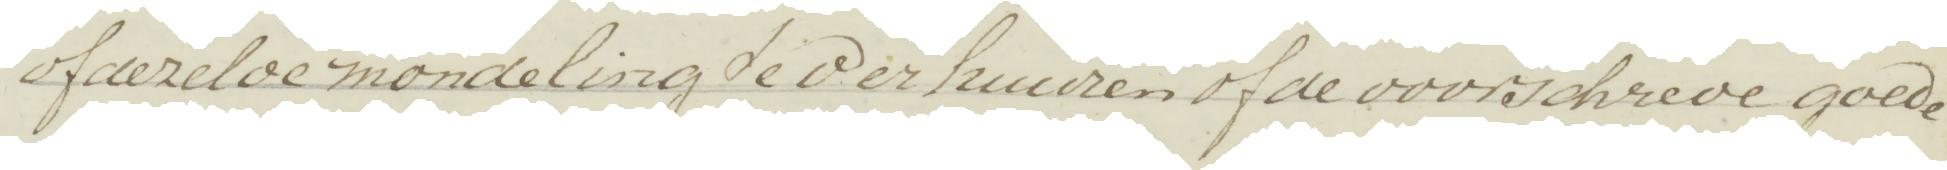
of dezelve mondeling te Verhuuren of de voorschreve goede
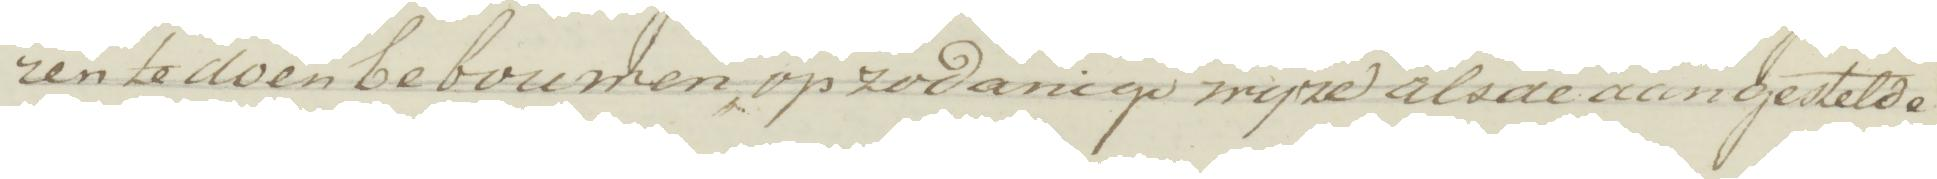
ren te doen bebouwen, op zodanige wyze als de aangestelde
